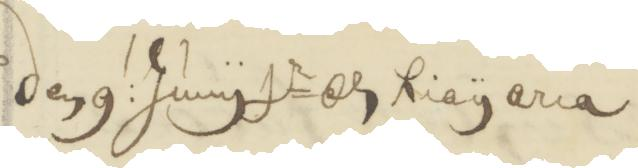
den 9:' Junij P=r den hiaij aria
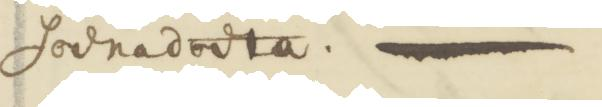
soenadoeta. —
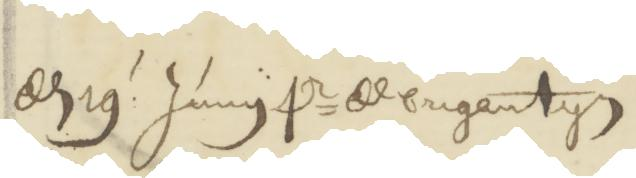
den 19:' Junij P=r de brigertijn
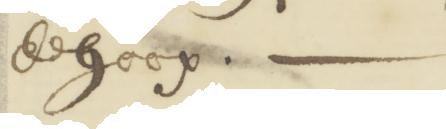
de Hoop. —
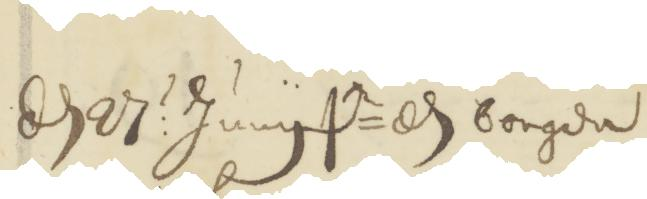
den 27:' Junij P=r den borger
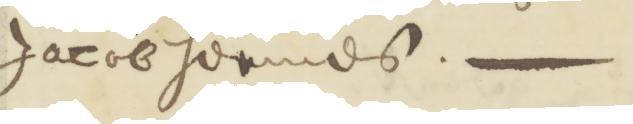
Jacob sermes. —
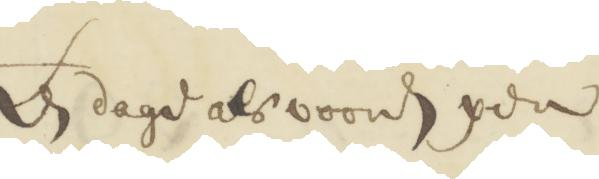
ten dage als vooren per
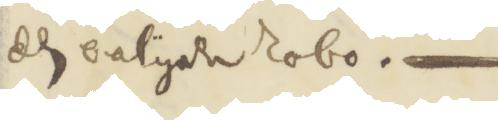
den balije Robo. —
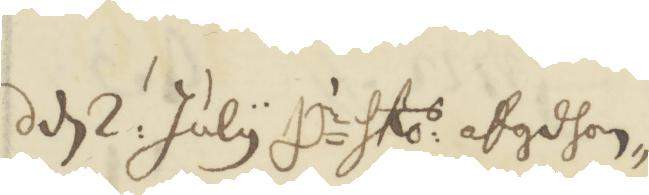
den 2:' Julij P=r sto:s afgeson„
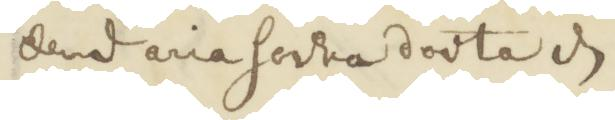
derd aria soera doeta en
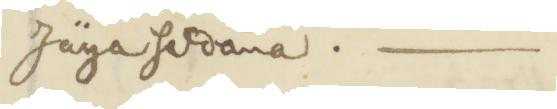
Jaija sedana. —
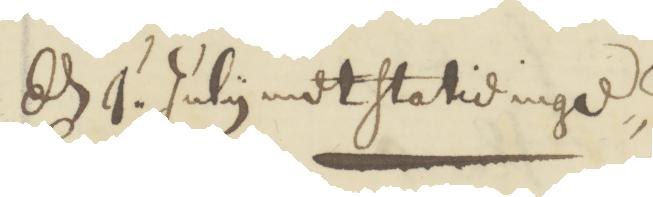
den 4„' Julij met statie inge„
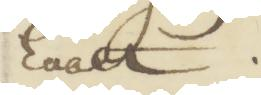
haalt
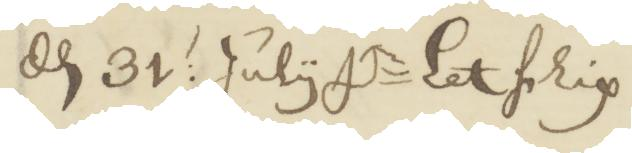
den 31:' Julij P=r het schip
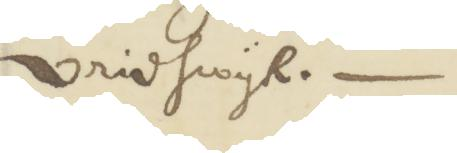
vrieswijk. —
